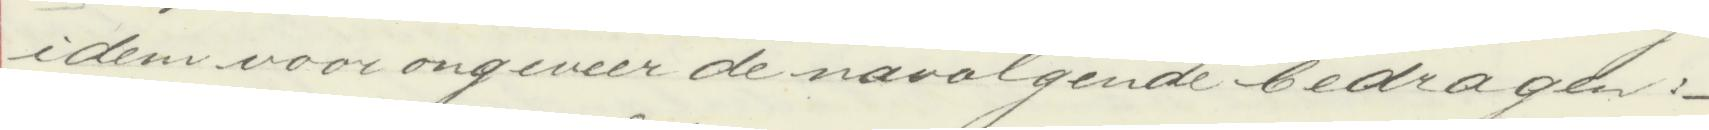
idem voor ongeveer de navolgende bedragen:
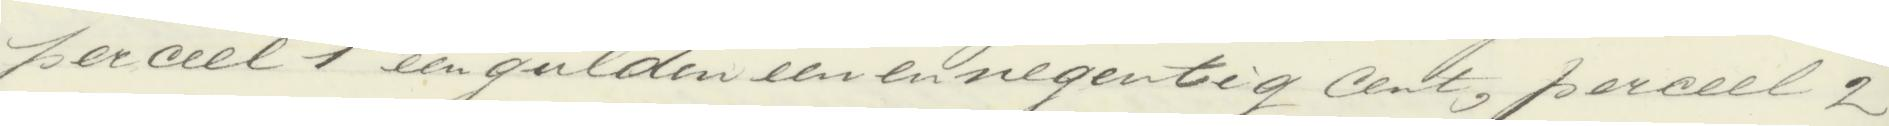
perceel 1 een gulden een en negentig cent, perceel 2
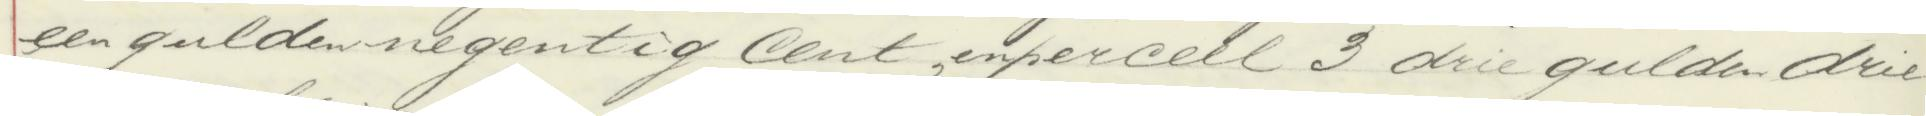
een gulden negentig Cent, en perceel 3 drie gulden drie
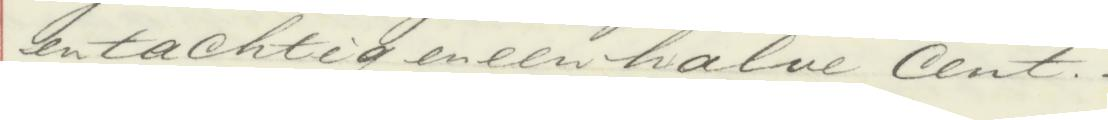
en tachtig en een halve Cent.
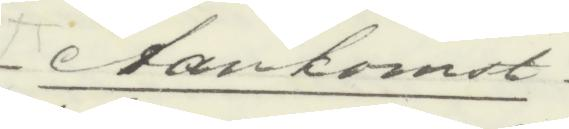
Aankomst.
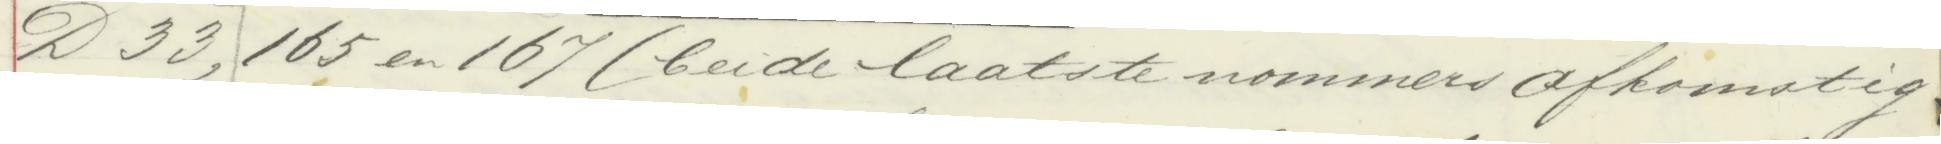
D 33, 165 en 167 (beide laatste nommers afkomstig
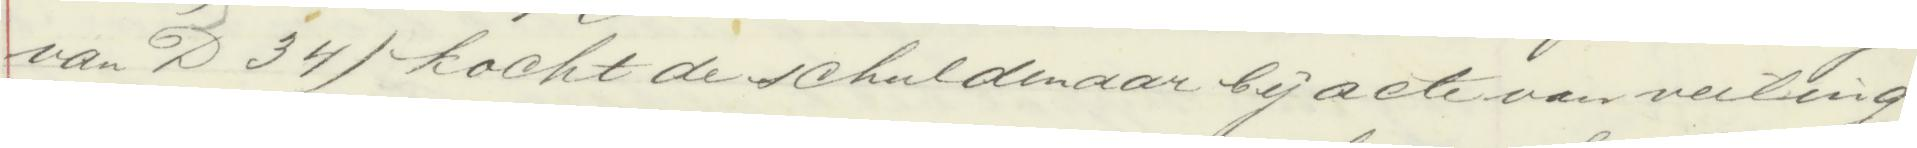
van D 34) kocht de schuldenaar bij acte van veiling
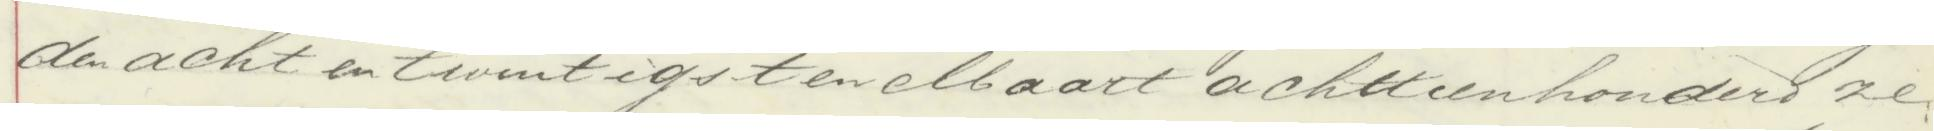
den acht en twintigsten Maart achttienhonderd ze
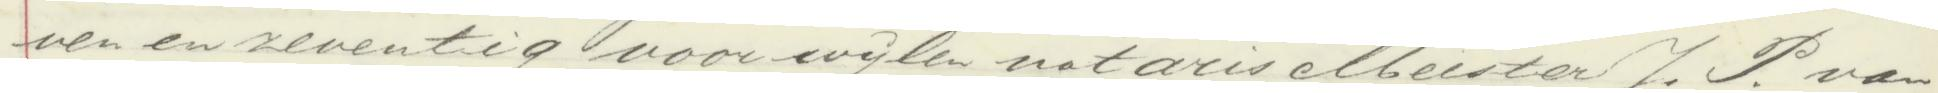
ven en zeventig voor wijlen notaris Meester J. P. van
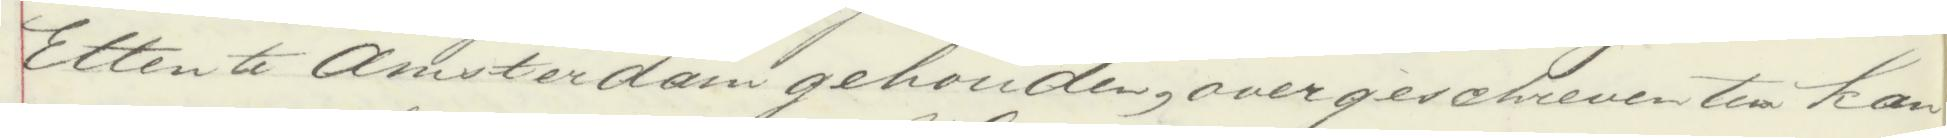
Etten te Amsterdam gehouden, overgeschreven ten kan
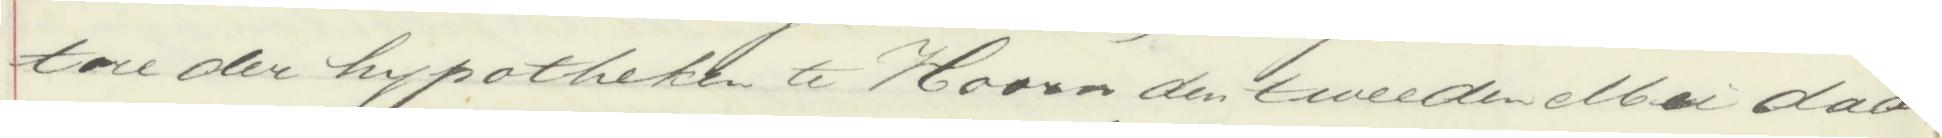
tore der hypotheken te Hoorn den tweeden Mei daar
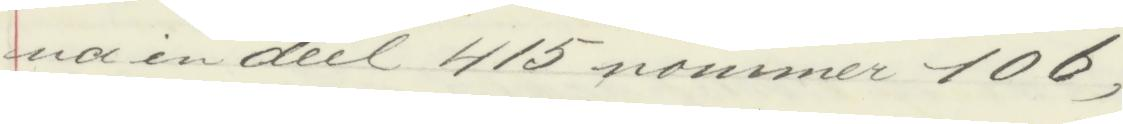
na in deel 415 nommer 106
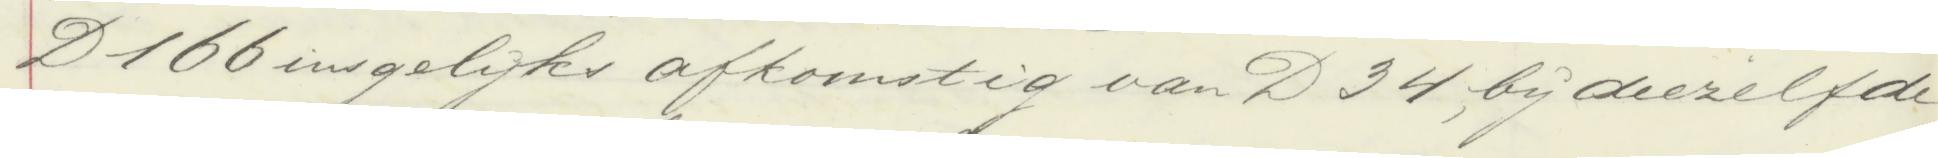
D166 insgelijks afkomstig van D 34, bij dezelfde
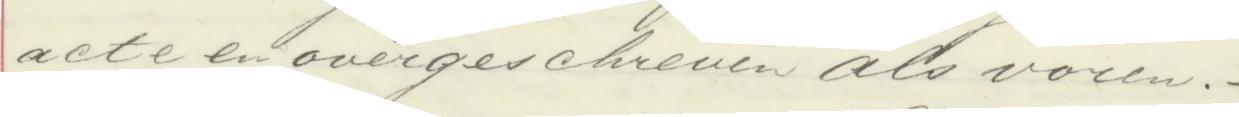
acte en overgeschreven als voren.
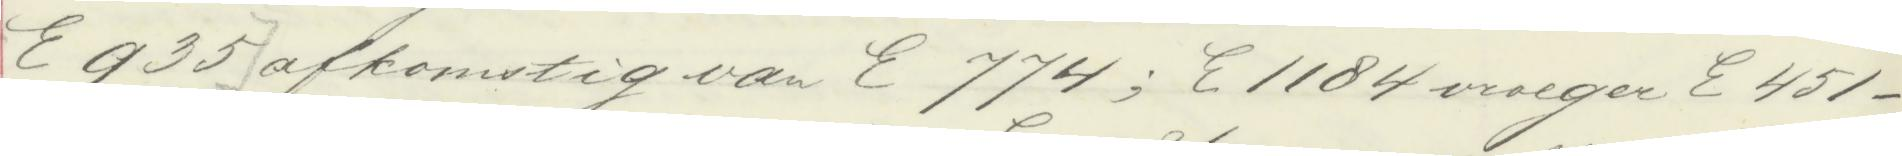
E 935 afkomstig van E 774; E 1184 vroeger E 451-
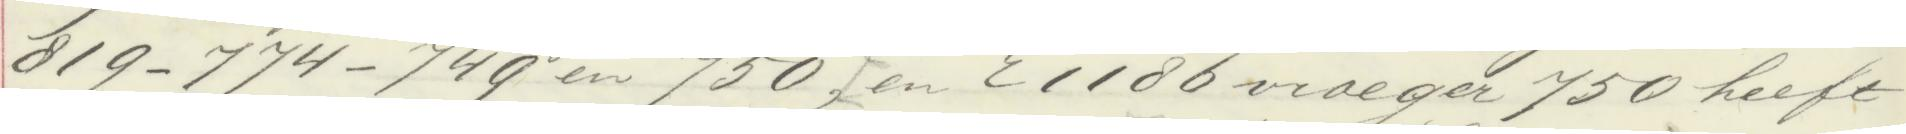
819- 774- 749 en 750, en E 1186 vroeger 750 heeft
